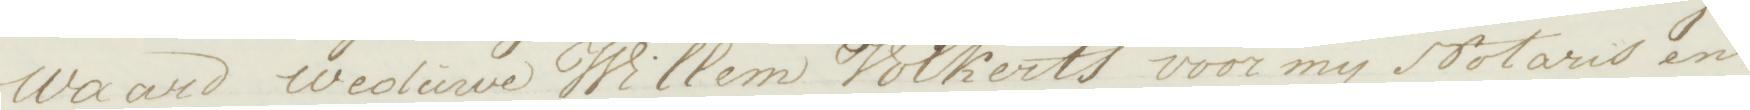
waard weduwe Willem Volkerts voor my Notaris en
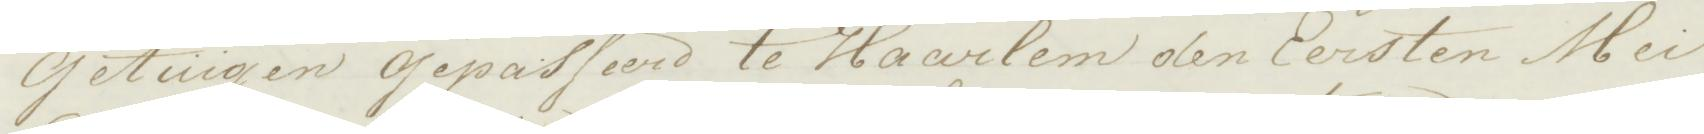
Getuigen gepasseerd te Haarlem den Eersten Mei
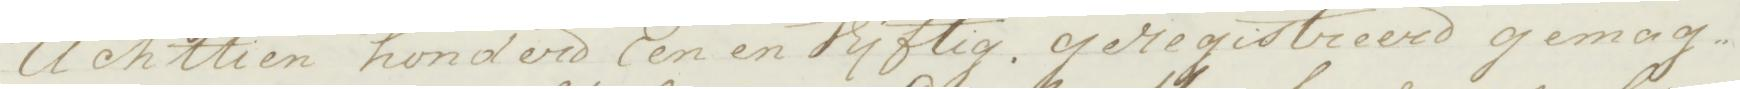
Achttien honderd Een en Vijftig, geregistreerd gemag„
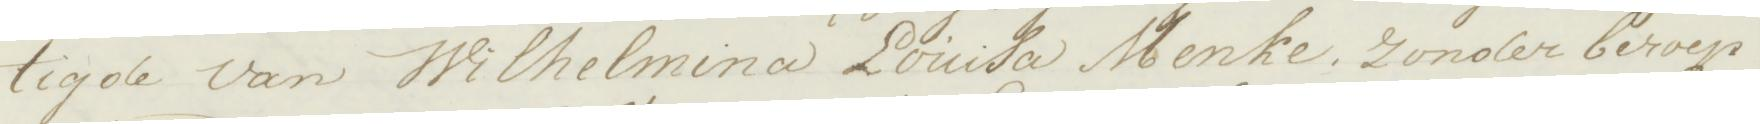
tigde van Wilhelmina Louisa Menke, zonder beroep
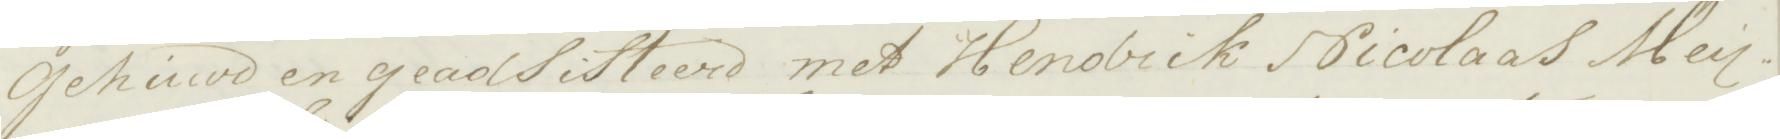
gehuwd en geadsisteerd met Hendrik Nicolaas Meij„
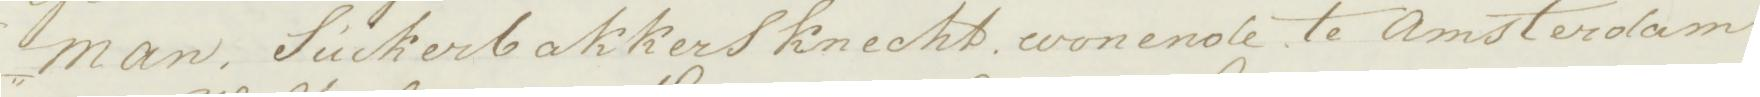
man, suikerbakkers knecht, wonende te Amsterdam
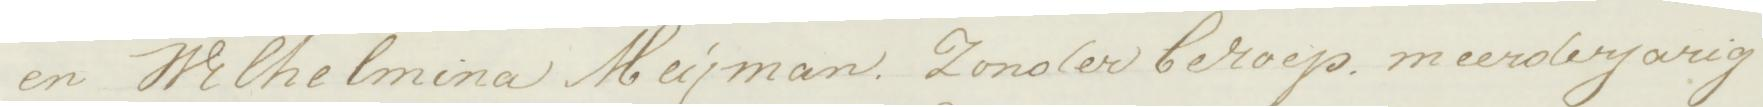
en Wilhelmina Meijman, zonder beroep, meerderjarig
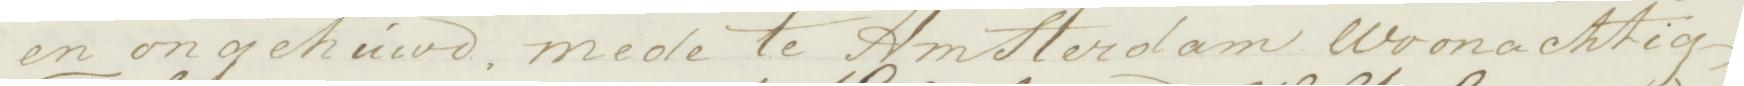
en ongehuwd, mede te Amsterdam woonachtig
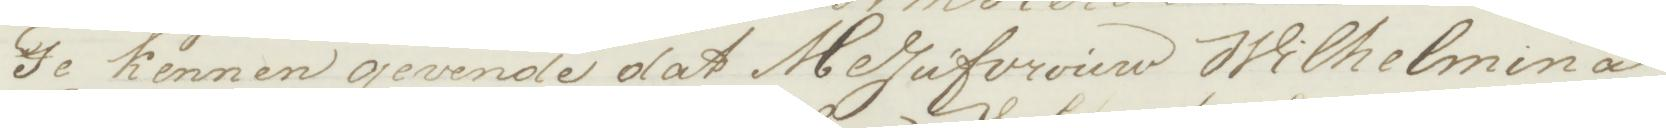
Te kennen gevende dat Mejufvrouw Wilhelmina
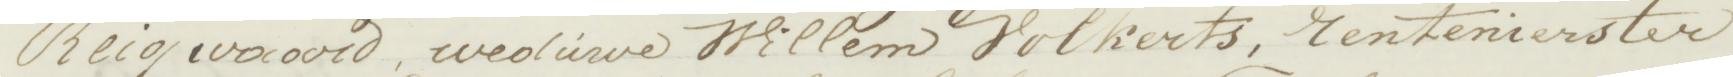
Reigwaard, weduwe Willem Volkerts, rentenierster
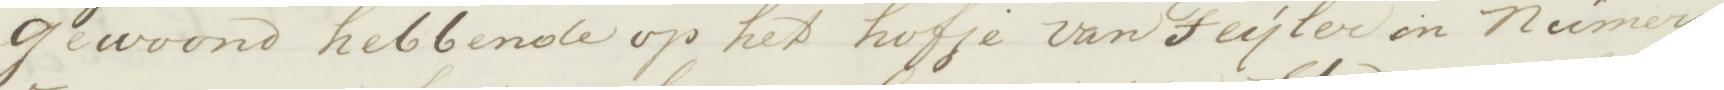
gewoond hebbende op het hofje van Teijler in Numero
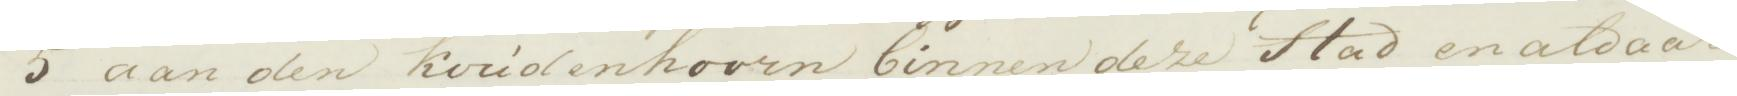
5 aan den koudenhoorn binnen deze stad en aldaar
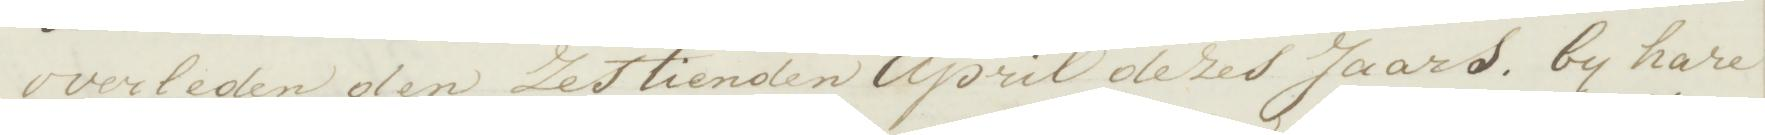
overleden den Zestienden April dezes Jaars, by hare
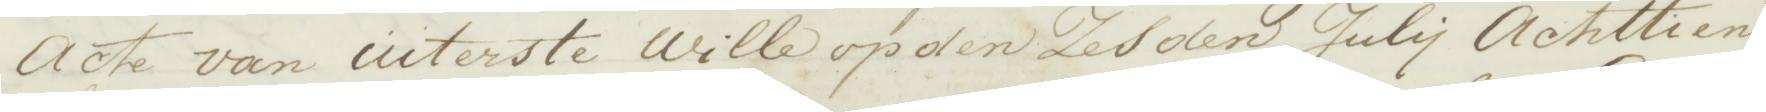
Acte van uiterste Wille op den Zesden Julij Achttien
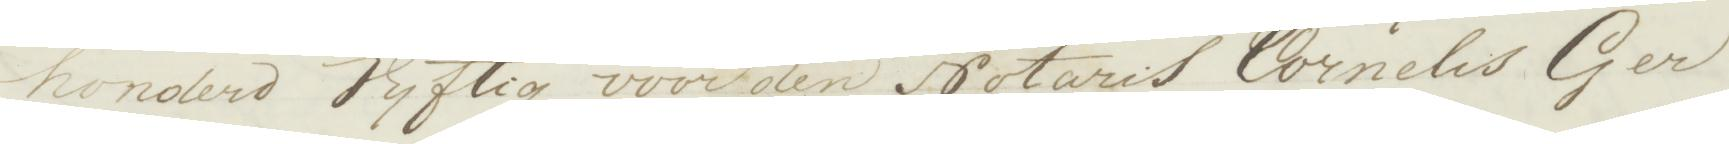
honderd Vyftig voor den Notaris Cornelis Ger
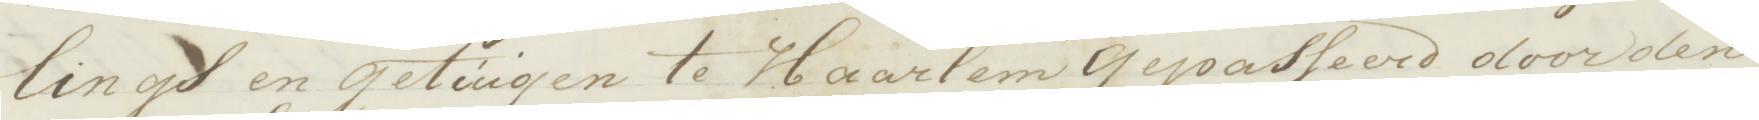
lings en getuigen te Haarlem gepasseerd door den
